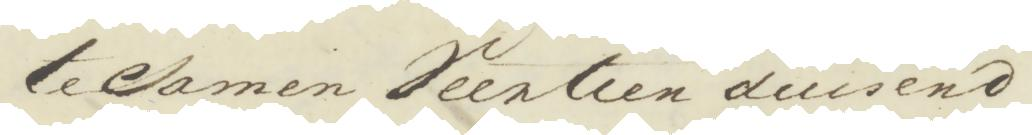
tesamen Veertien duisend
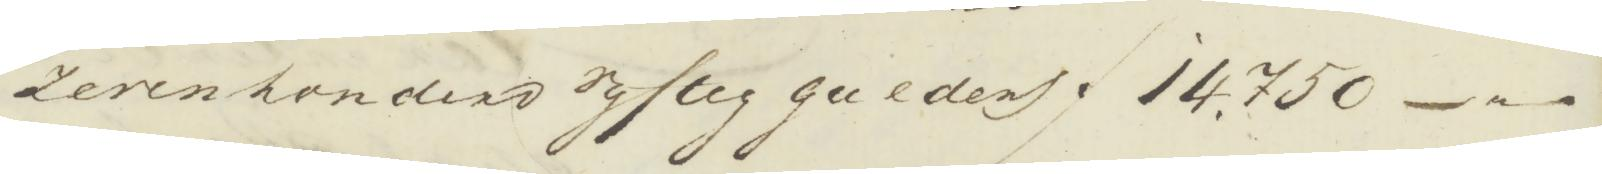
zeven honderd vijftig guldens ƒ 14.750 — : —
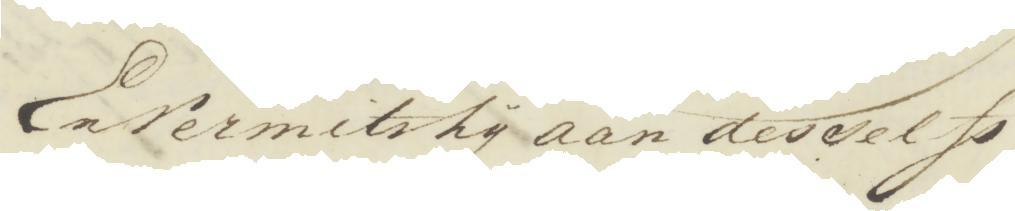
En vermits hij aan desselfs
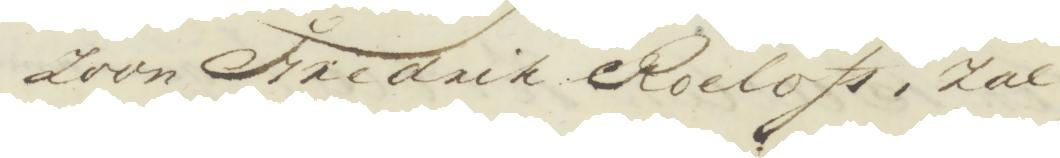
zoon Fredrik Roelofs, zal
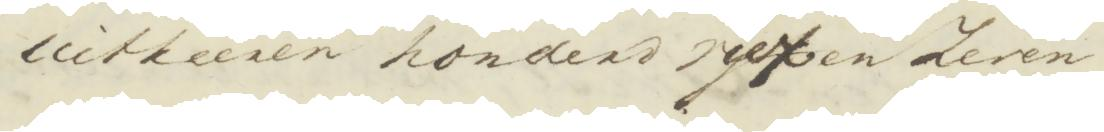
uitkeeren honderd vieren zeven
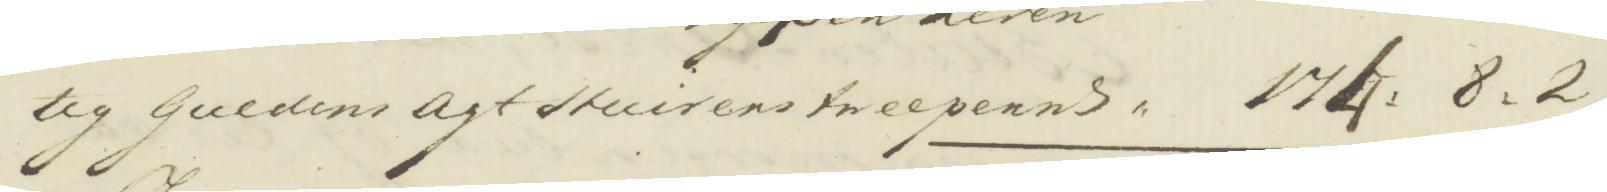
tig guldens agt stuivers twee pennen„ 174: 8: 2
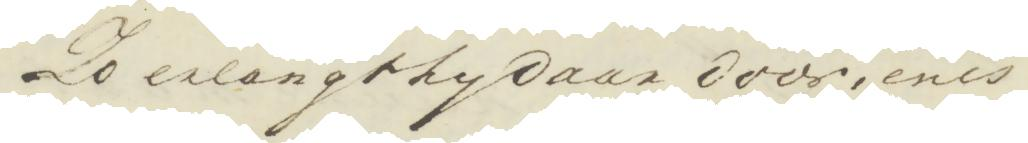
Zo erlangt hy daar door, en is
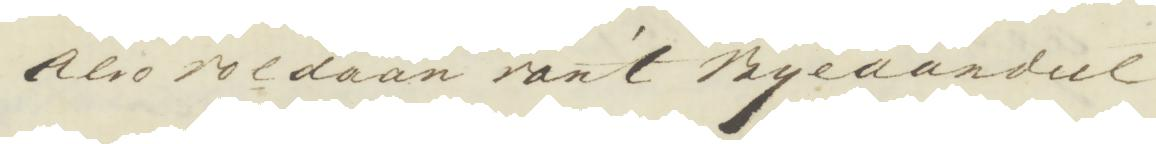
also voldaan van ’t vrye aandeel
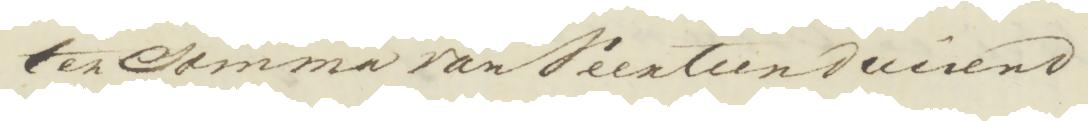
ter somma van Veertien duisend
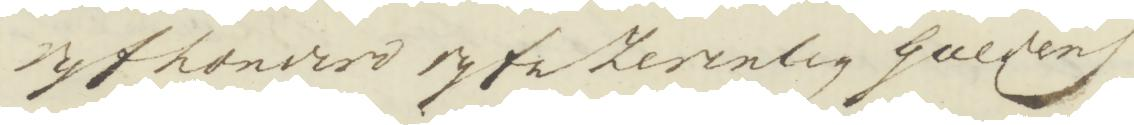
vijfhonderd vijfn zeventig Guldens
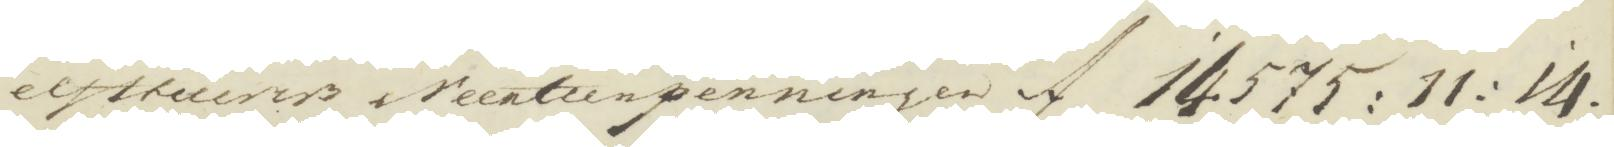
elf stuivers Veertien penningen ƒ 14.575: 11: 14.
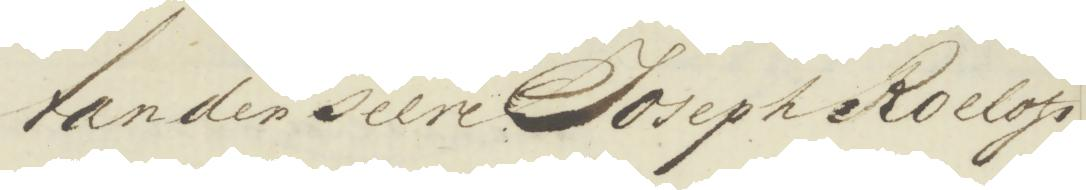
Aan der selve Ioseph Roelofs
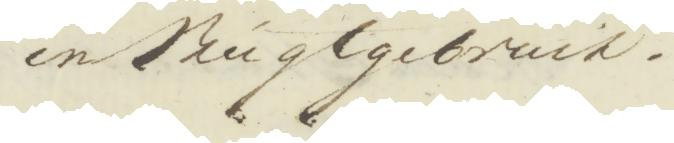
in Vrugtgebruik.
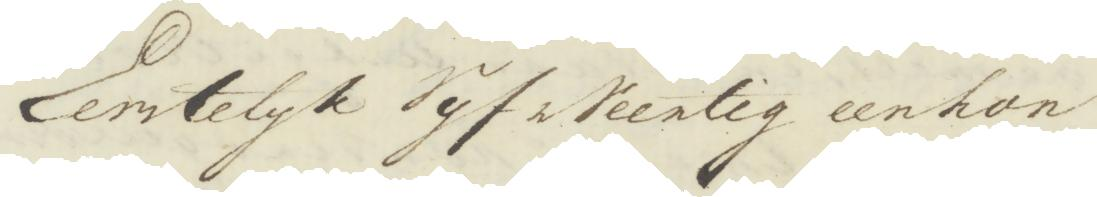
Eerstelijk vijfnveertig een hon
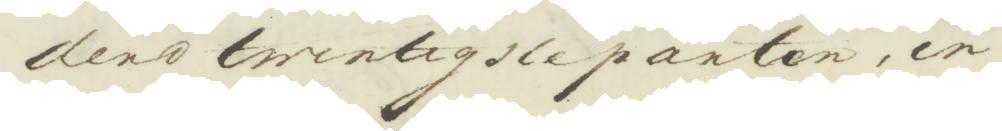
derds twintig ste parten, in
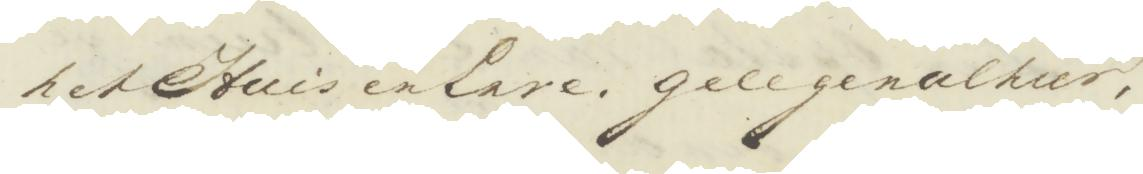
het Huis en Erve, gelegen alhier,
